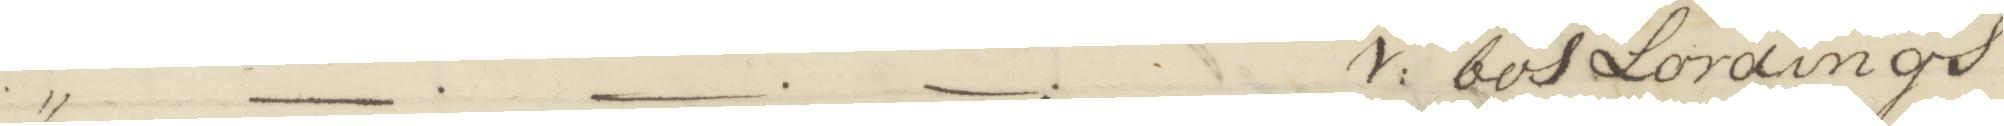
„ — : — : — : 1: bos Lordings
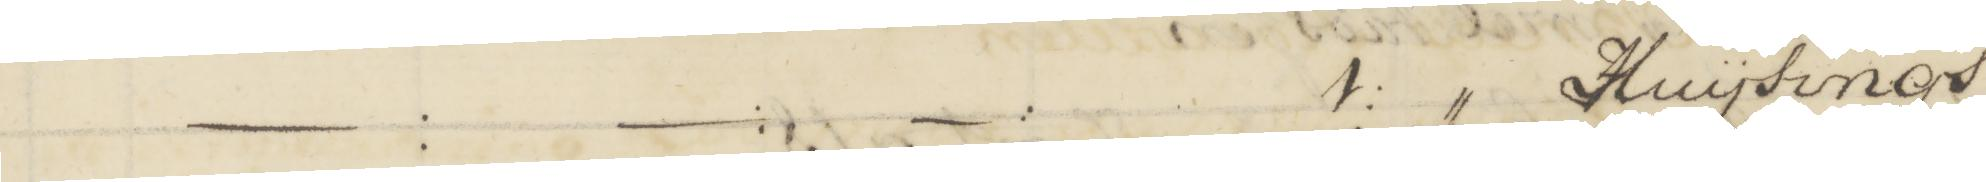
— : — : — : 1: „ Huijsings
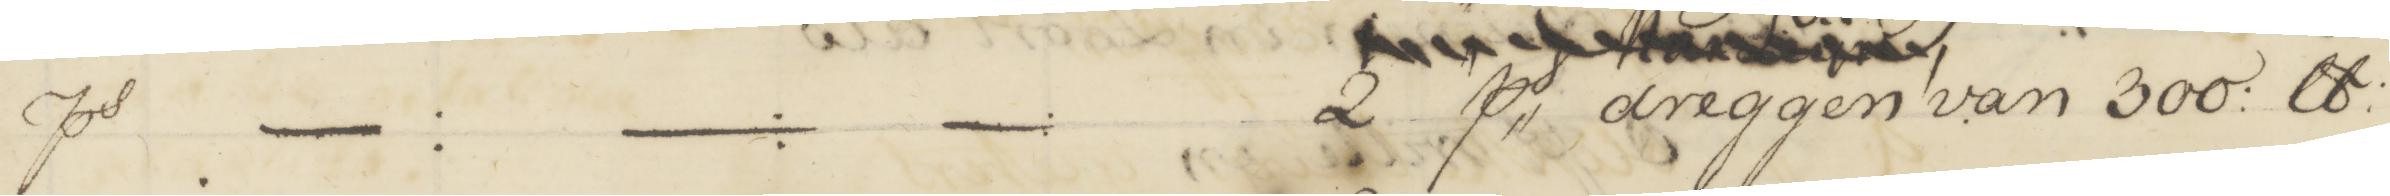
ps — : — : — : 2 p„s dreggen van 300: lb:
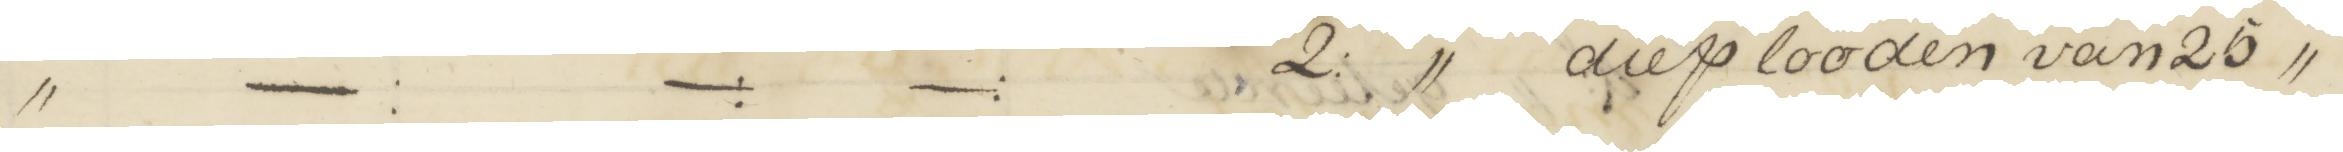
„ — : — : — : 2: „ diep looden van 25 „
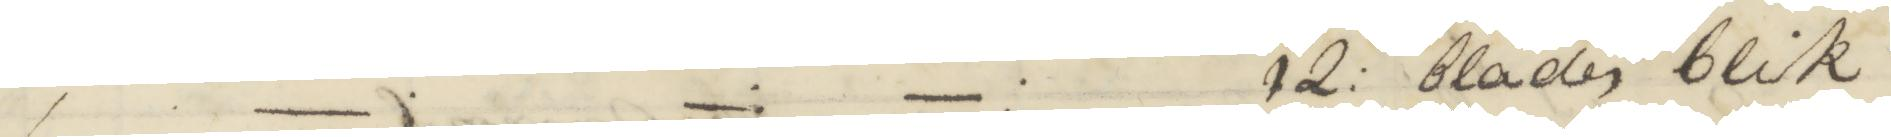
„ — : — : — : 12: bladen blik
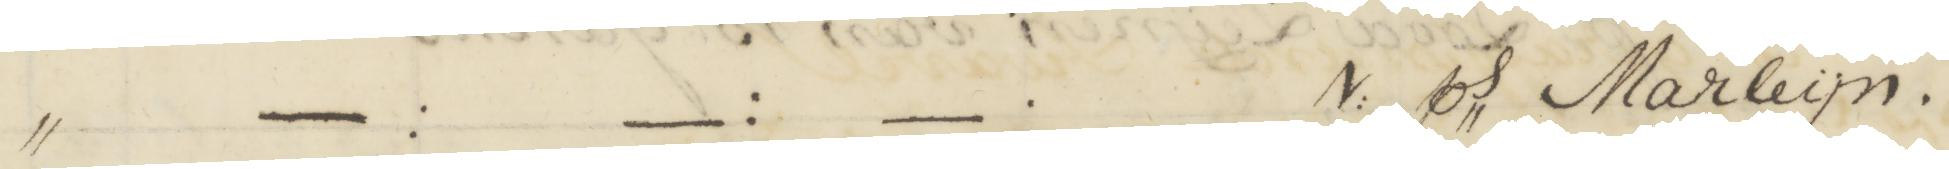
„ — : — : — : 1: p„s Marleijn.
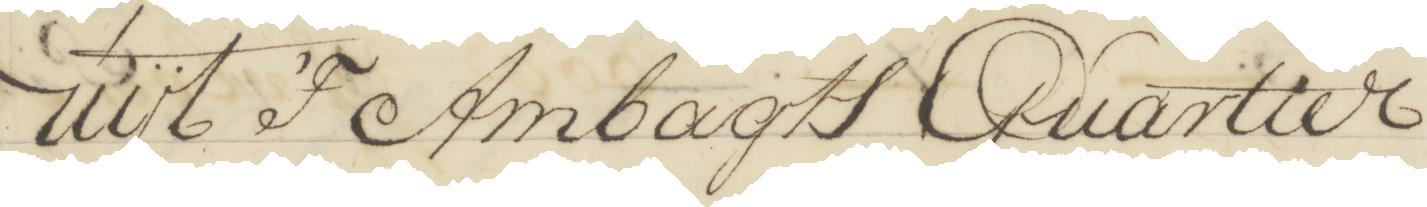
uijt ’T Ambagts Quartier
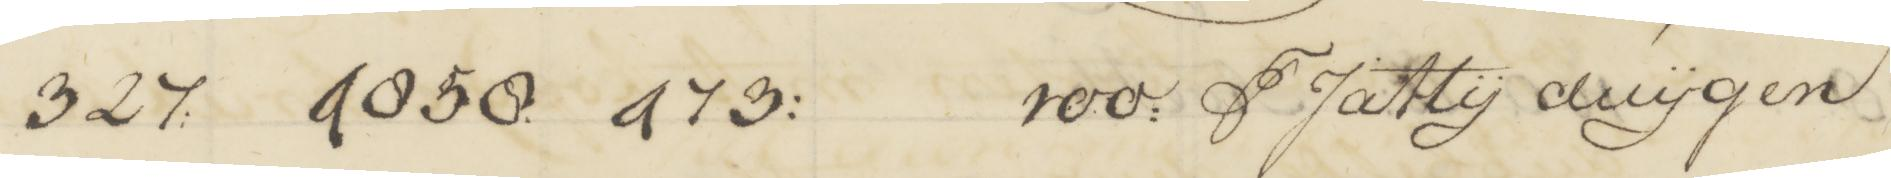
327: 4858: 473: 100: p:' Jattij duijgen
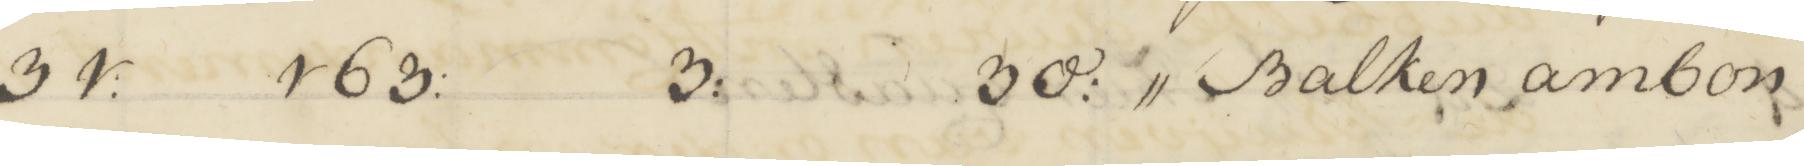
31: 163: 3: 30: „ Balken ambon
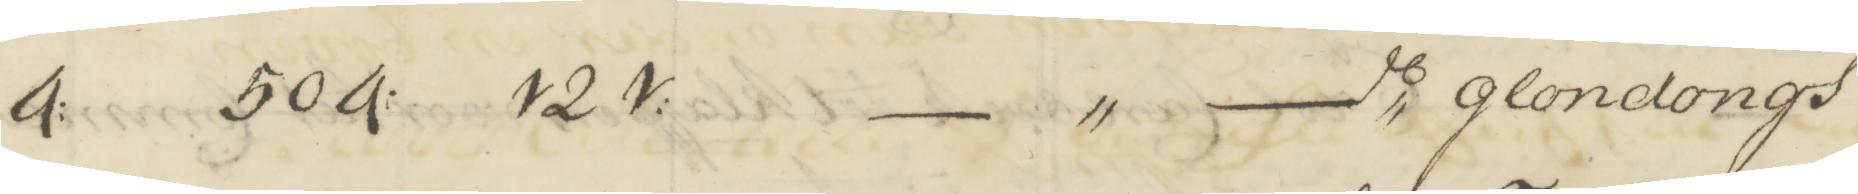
4: 504: 121: — „ —„o glondongs
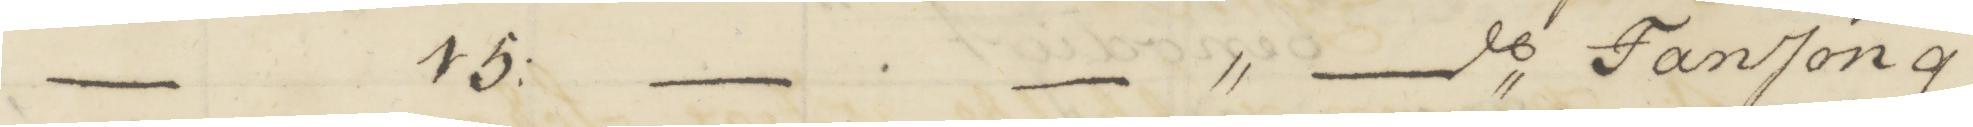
— 15: — — „ —„o Tanjong
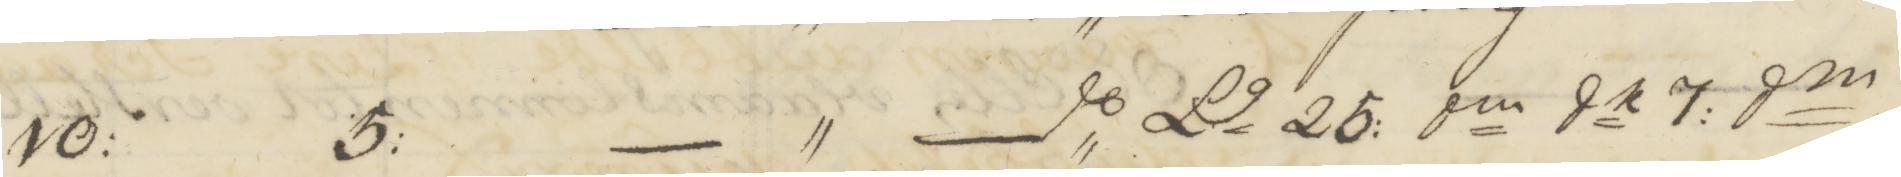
— 10: 5: — „ —„o L=g 25: d=m d=k 7: d=m
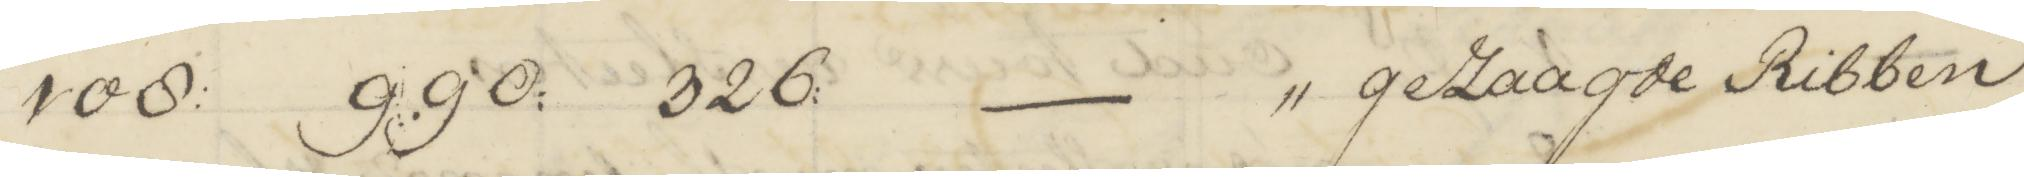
108: 990: 326: — „ gezaagde Ribben
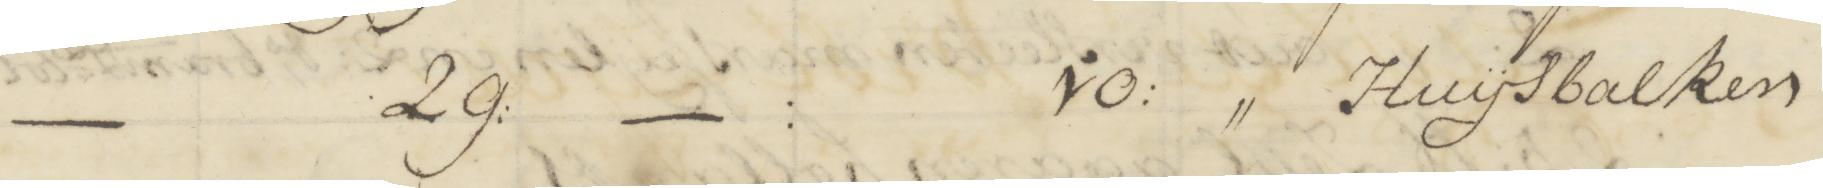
— 29: — : 10: „ Huijsbalken
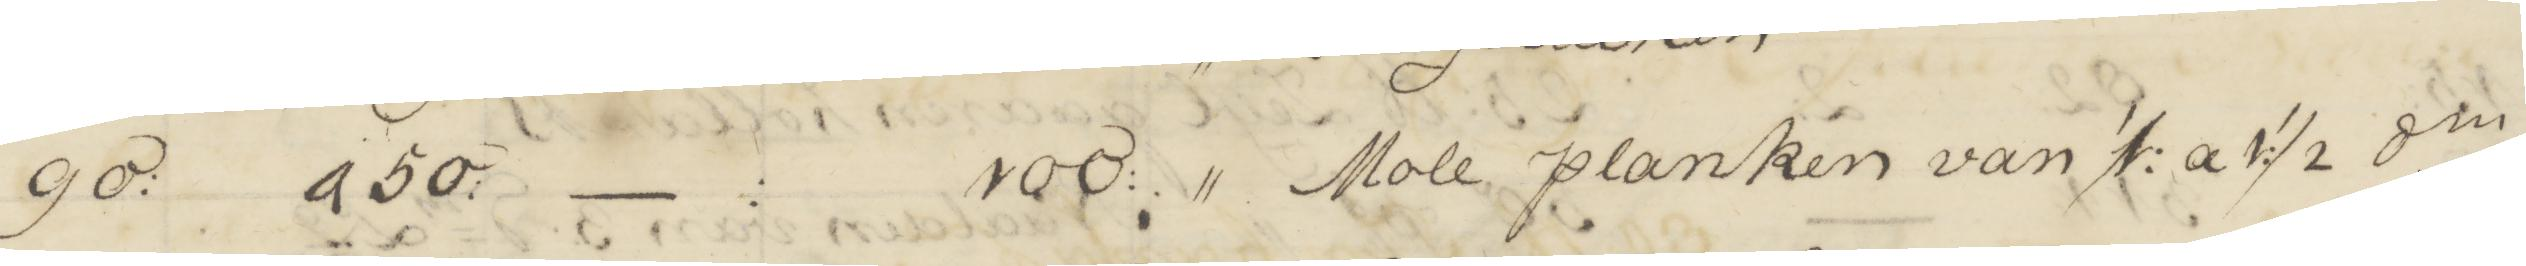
90: 450: — : 100: „ Mole planken van '1: a 1:½ d:m
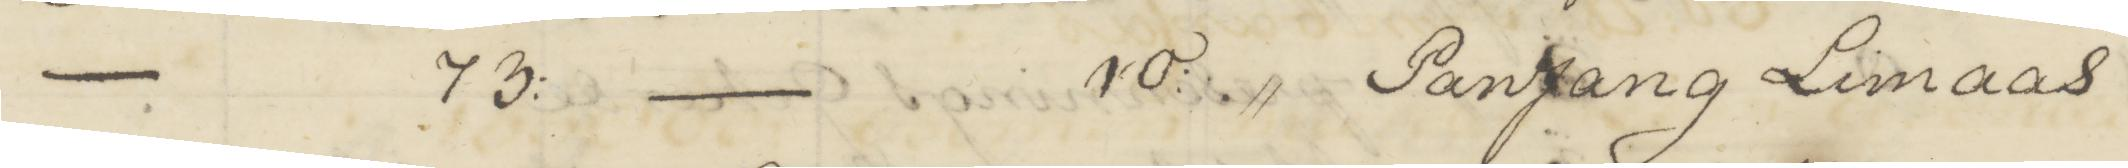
— 73: — 10: „ Panjang Limaas
